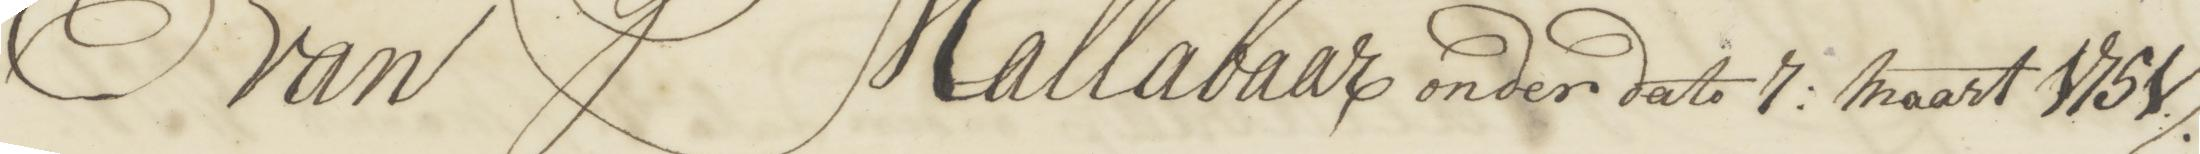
Van Mallabaar onder dato 7: Maart 1751./.
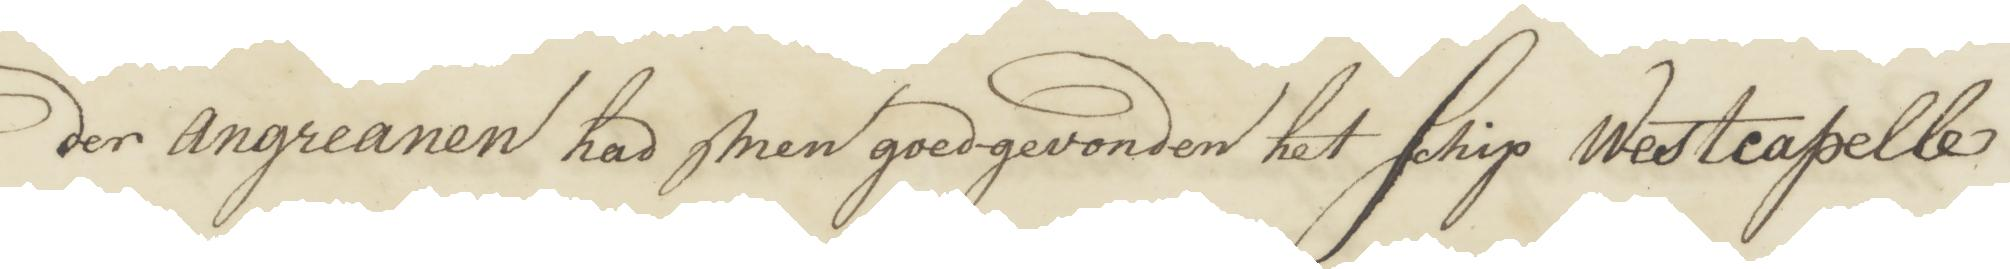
der angreanen had men goed gevonden het schip westcapelle
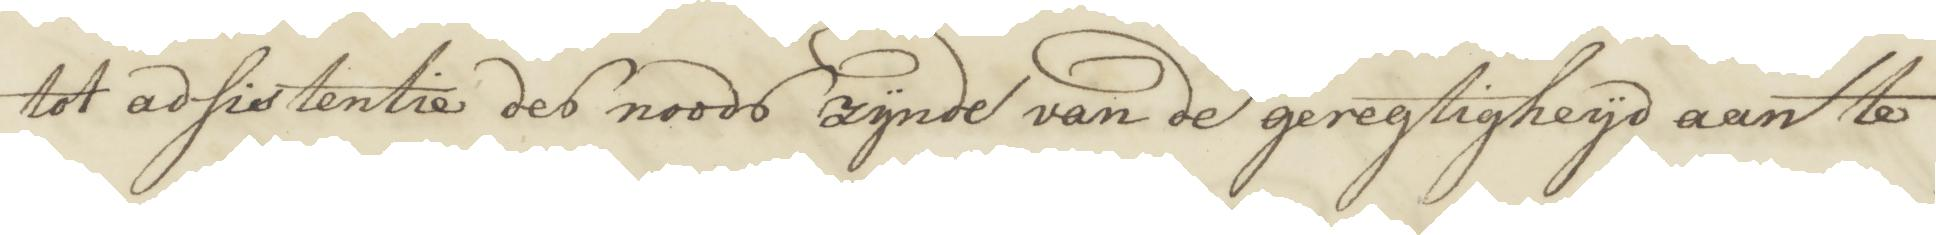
tot adsistentie des noods zijnde van de geregtigheijd aan te
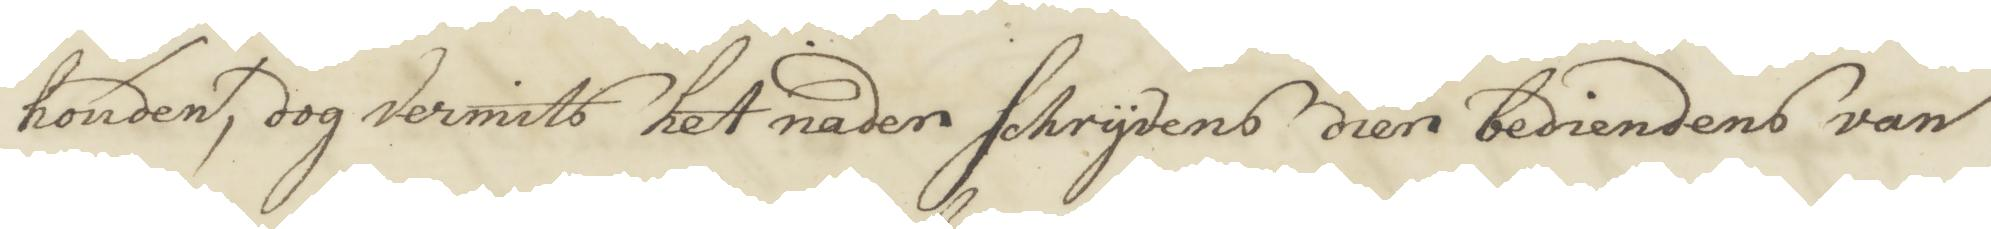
houden, dog vermits het nader schrijvens dier bediendens van
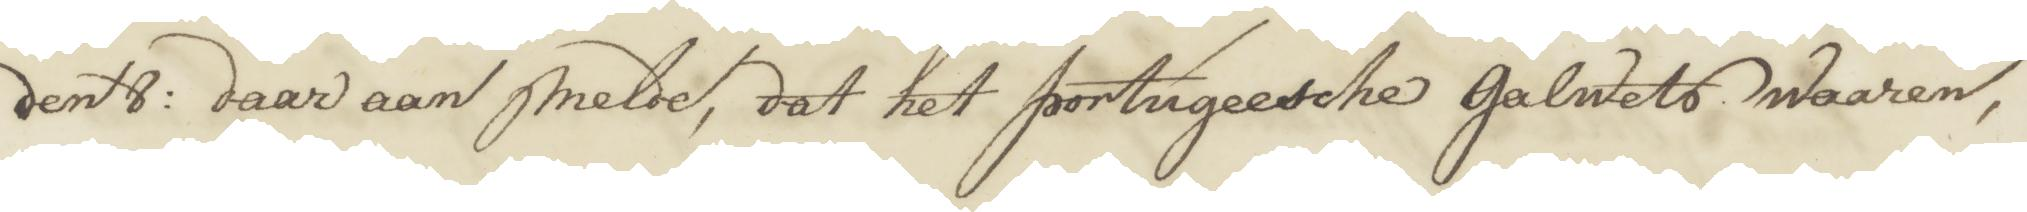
den 8: daar aan melde, dat het portugeesche galwets waaren,
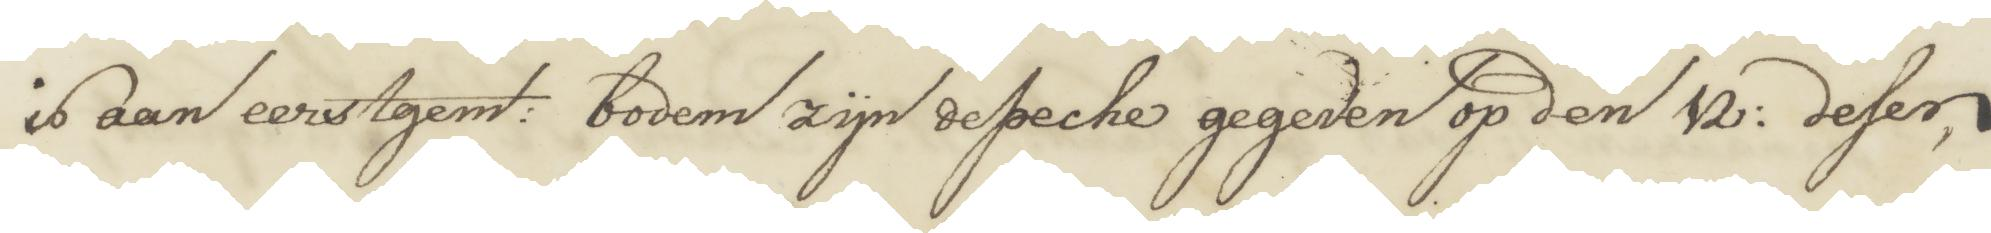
is aan eerstgem: bodem zijn depeche gegeven op den 12: deser,
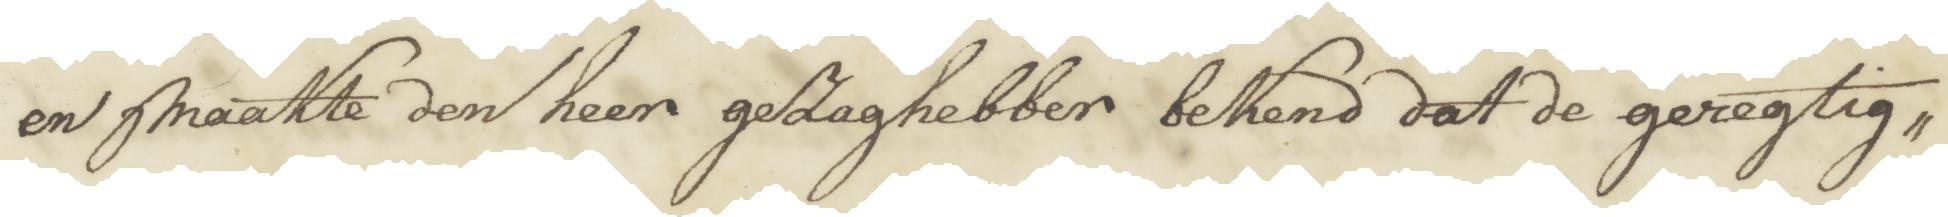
en maakte den heer gezaghebber bekend dat de geregtig„
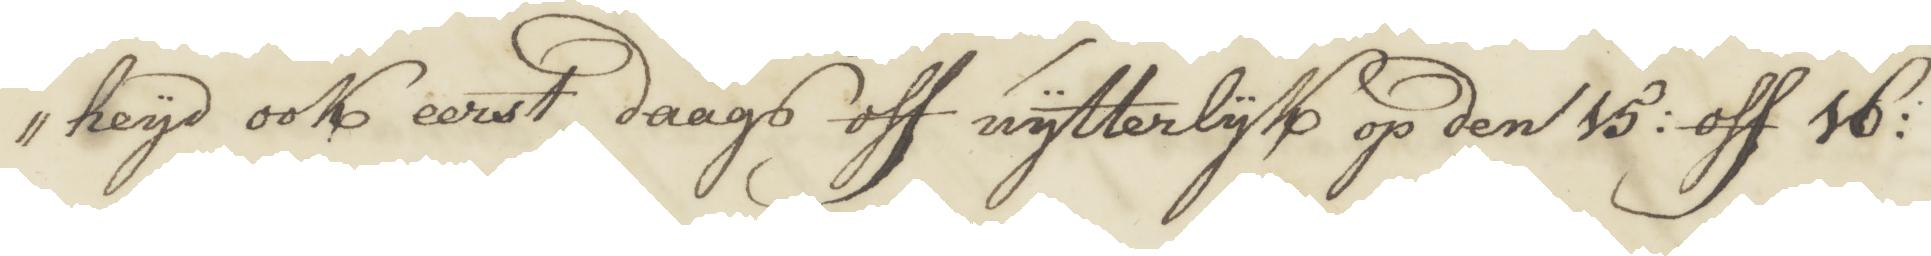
„heijd ook eerst daags off uijtterlijk op den 15: off 16:
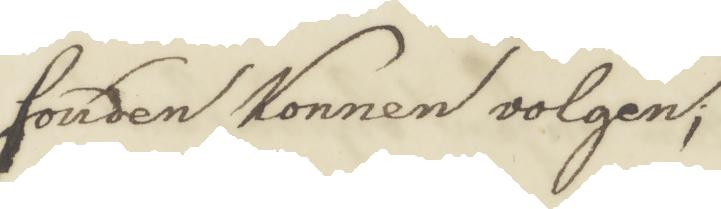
souden konnen volgen;
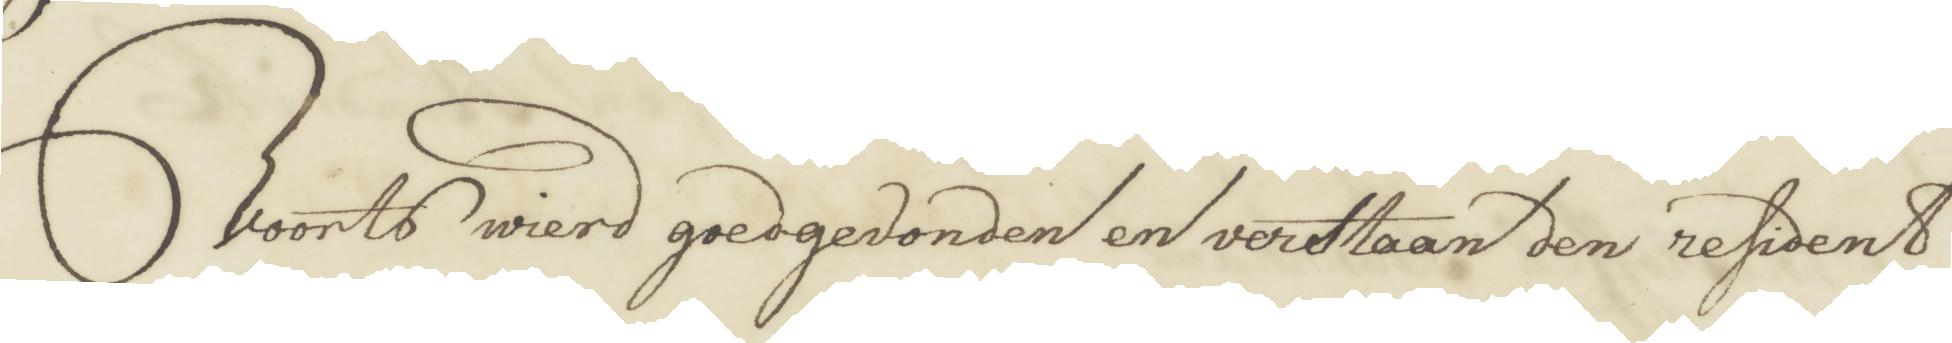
Voorts wierd goedgevonden en verstaan den resident
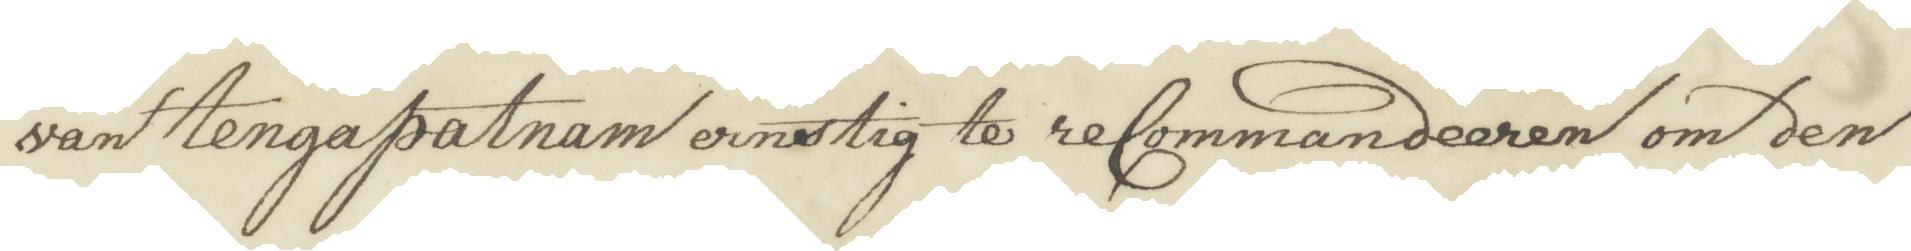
van tengapatnam ernstig te recommandeeren om den
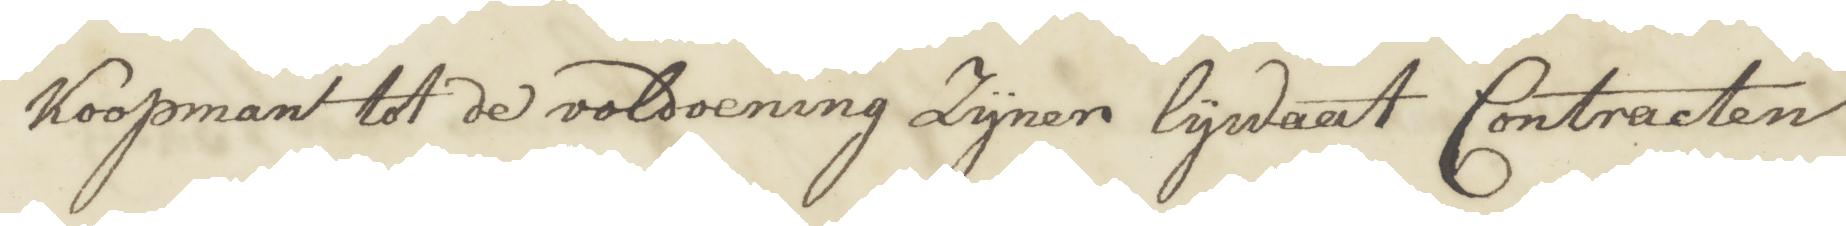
koopman tot de voldoening zijner lijwaat Contracten
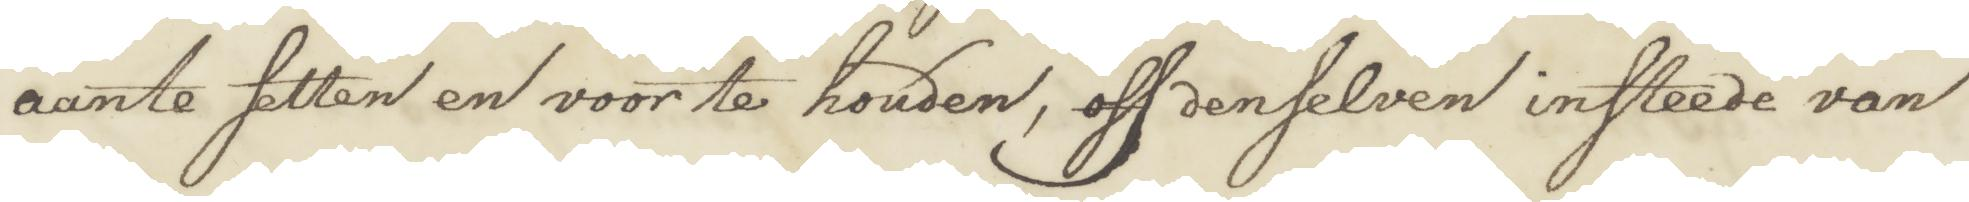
aante setten en voor te houden, off denselven insteede van
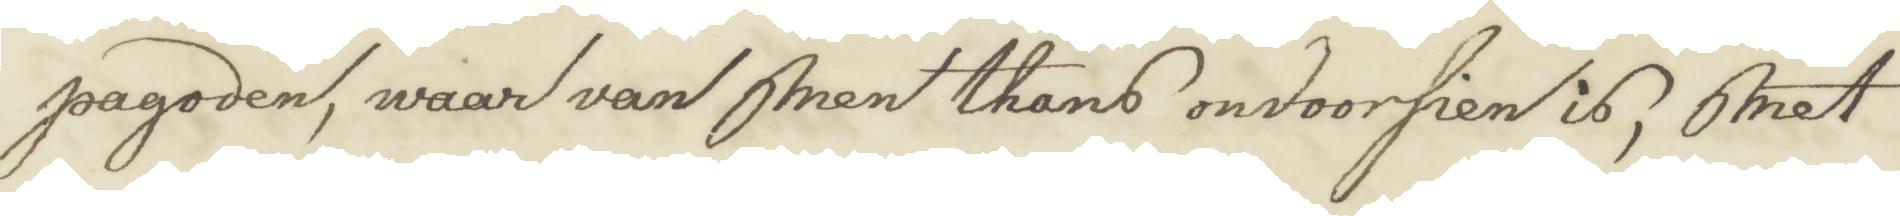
pagoden, waar van men thans onvoorsien is, met
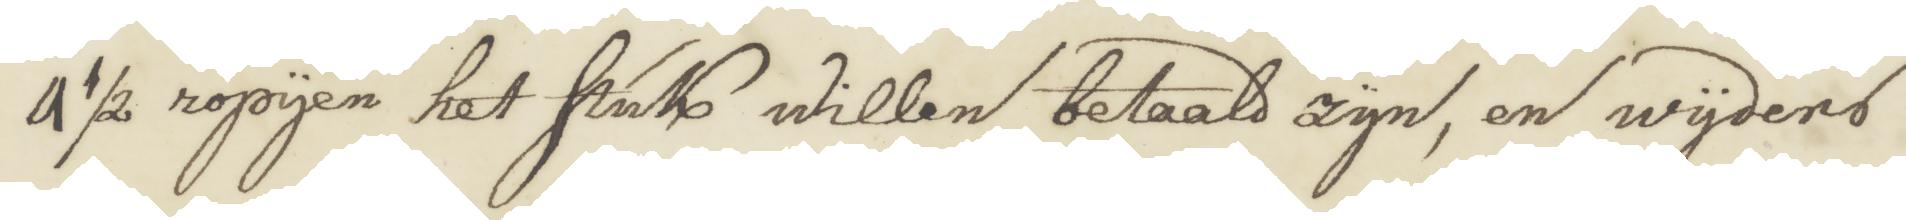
4½ ropijen het stuk willen betaald zijn, en wijders
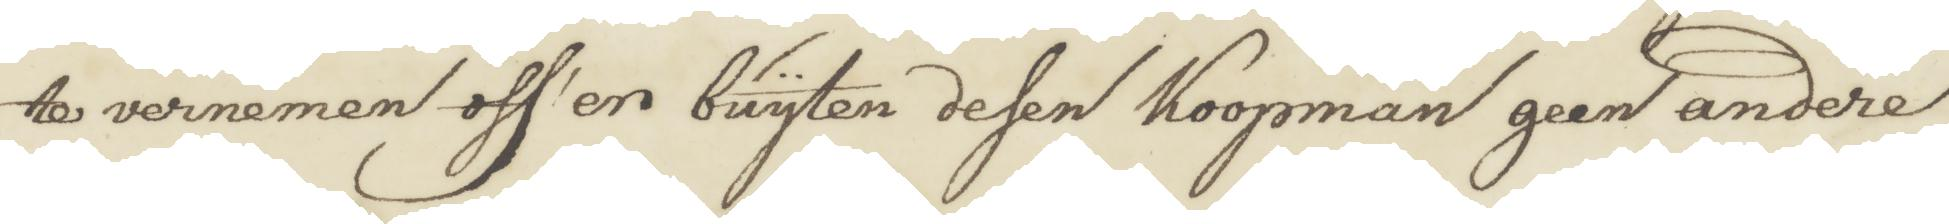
te vernemen off en buijten desen koopman geen andere
